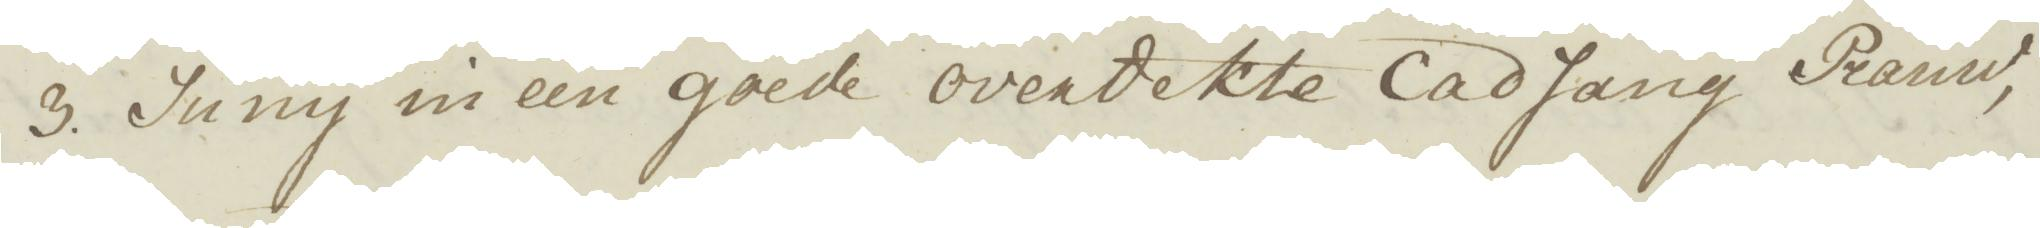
3. Iunij in een goede overdekte Cadjang Prauw,
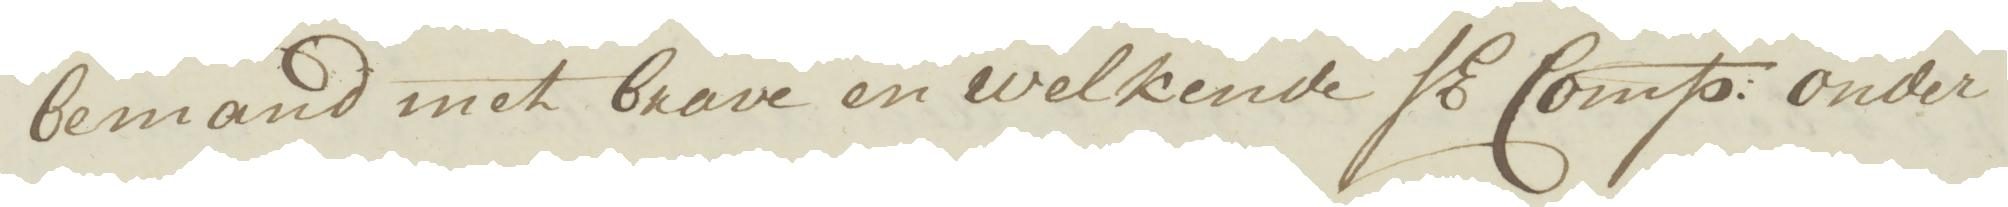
bemand met brave en welkende sE Comp: onder
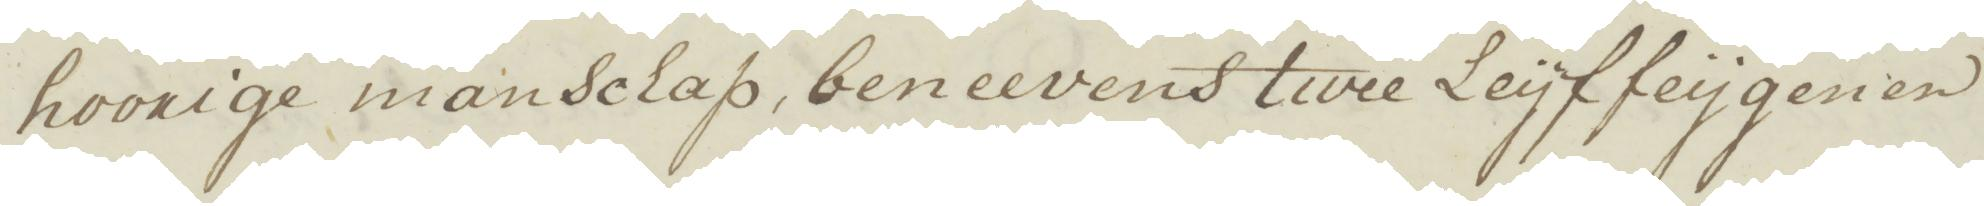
hoorige manschap, beneevens twee Leijffeijgenen
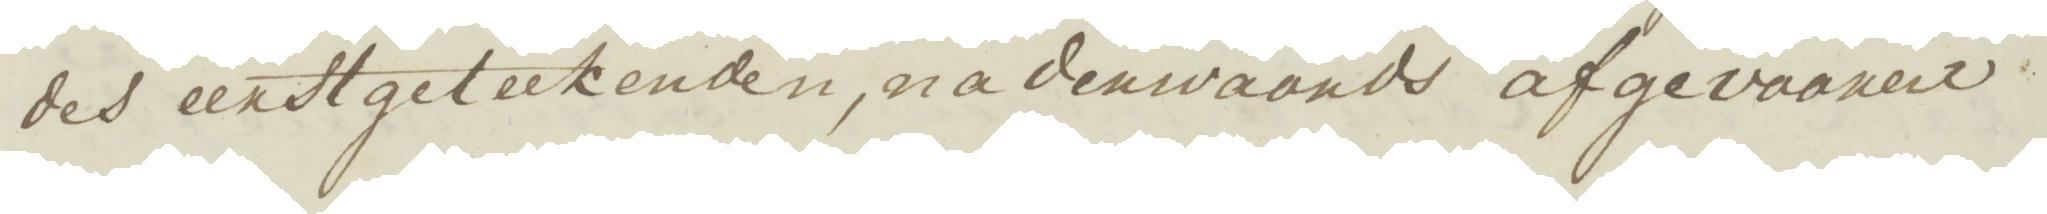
des eerstgeteekenden, na derwaards afgevaaren
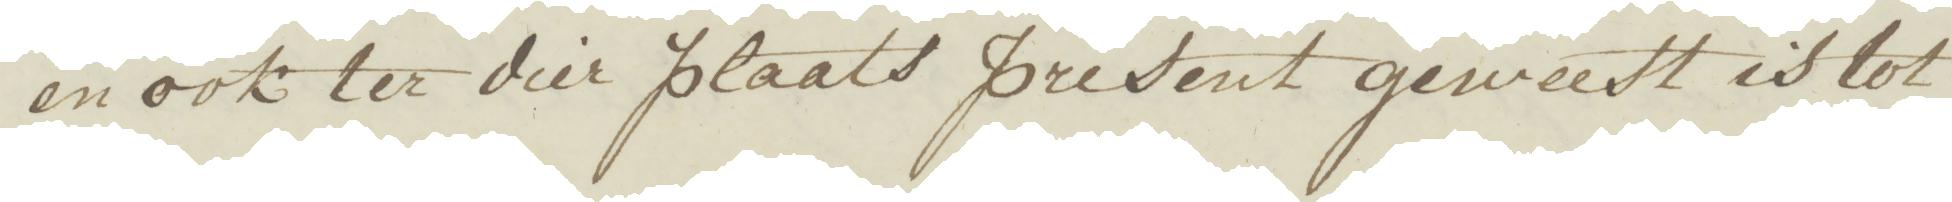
en ook ter dier plaats present geweest is tot
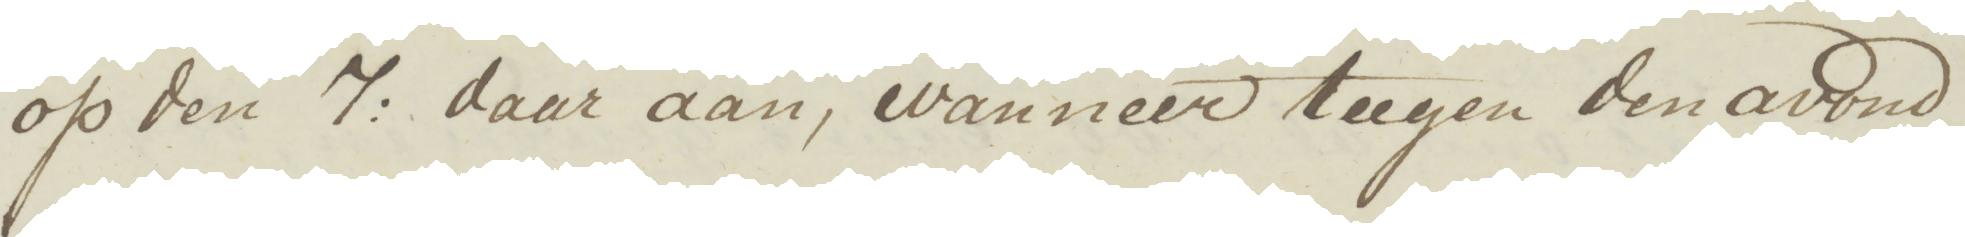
op den 7: daar aan, wanneer teegen den avond
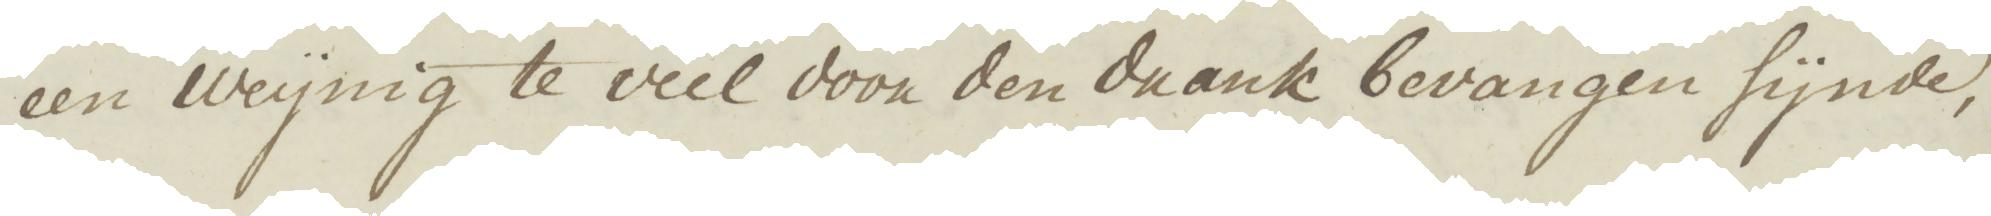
een weijnig te veel door den drank bevangen sijnde,
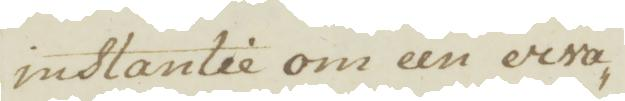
instantie om een erva„
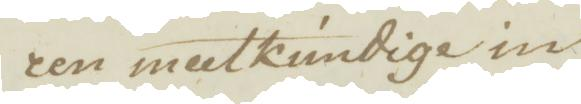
ren meetkundige in
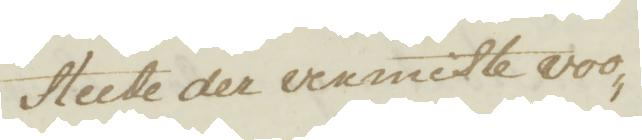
steede der vermiste voo„
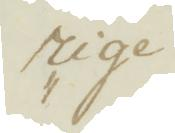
„rige
